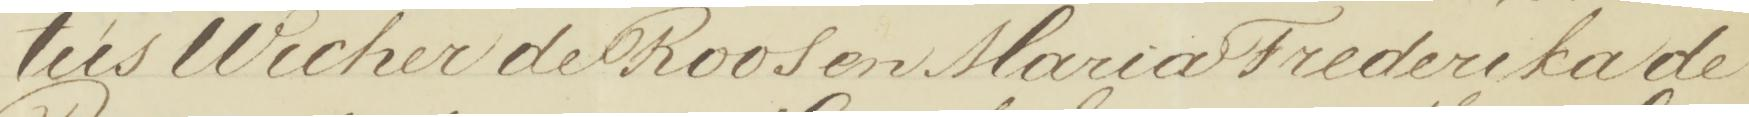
tus Wicher de Roos en Maria Frederika de
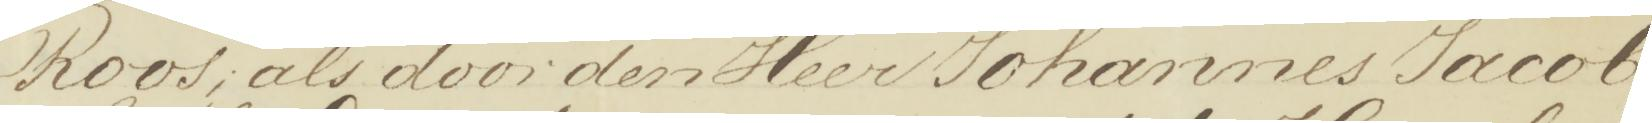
Roos; als door den Heer Iohannes Iacob
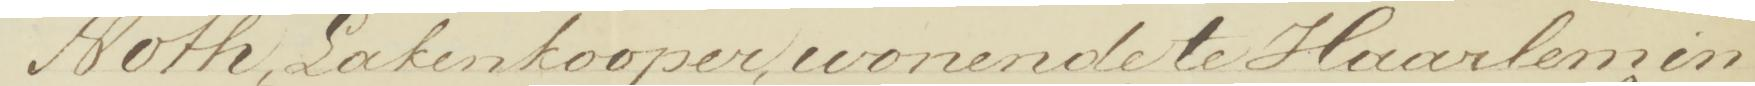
Noth, Lakenkooper, wonende te Haarlem in
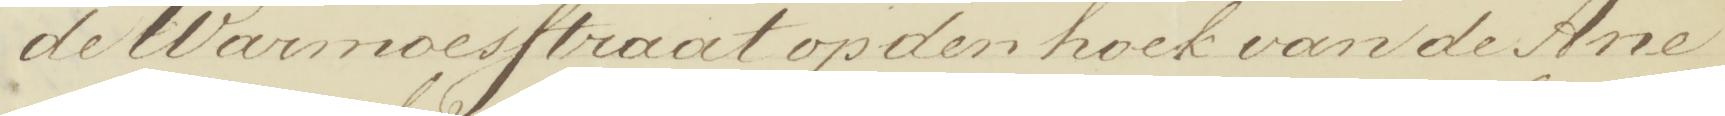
de Warmoesstraat op den hoek van de Ane
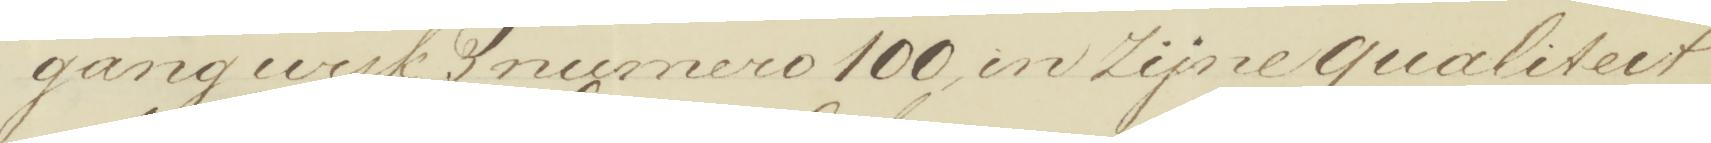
gang wyk 3 numero 100, in zijne qualiteit
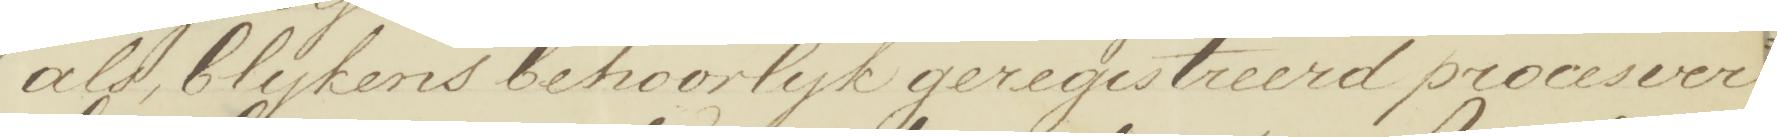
als, blykens behoorlijk geregistreerd procesver
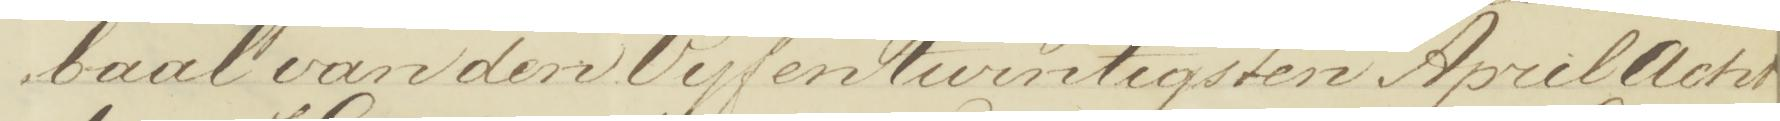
„baal van den Vijf en twintigsten April Acht
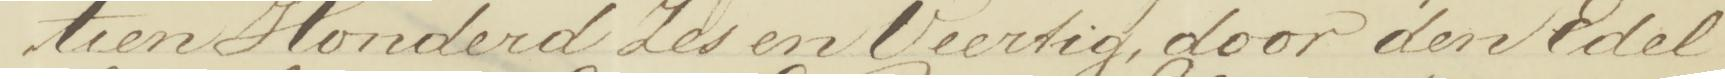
„tien Honderd Zes en Veertig, door den Edel
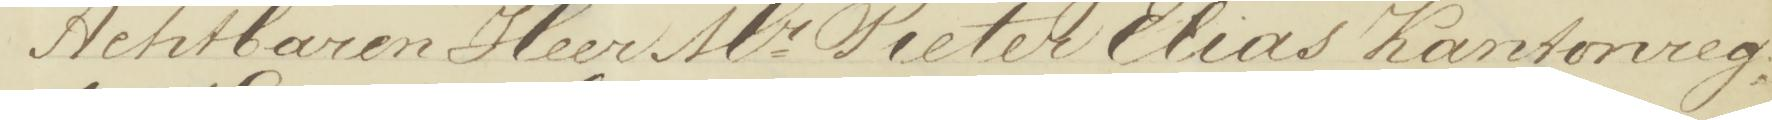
Achtbaren Heer M:r Pieter Elias Kantonreg
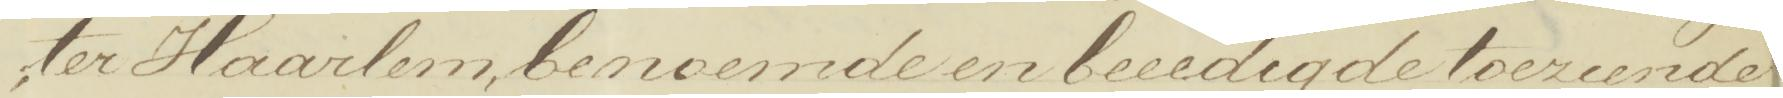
„ter Haarlem, benoemde en beeedigde toeziende
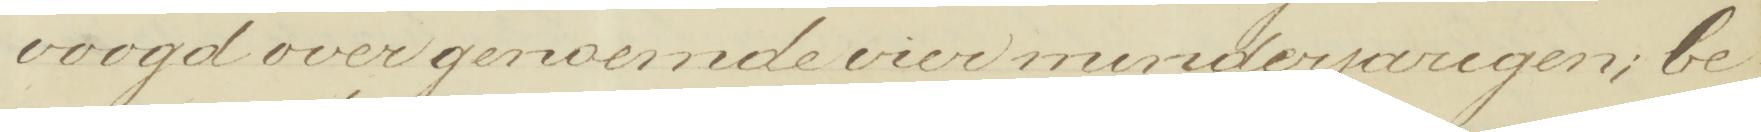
voogd over genoemde vier minderjarigen; be
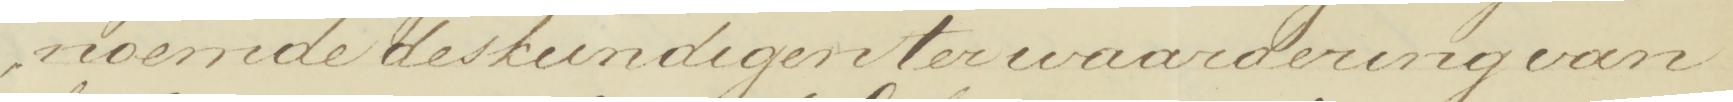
„noemde deskundigen ter waardering van
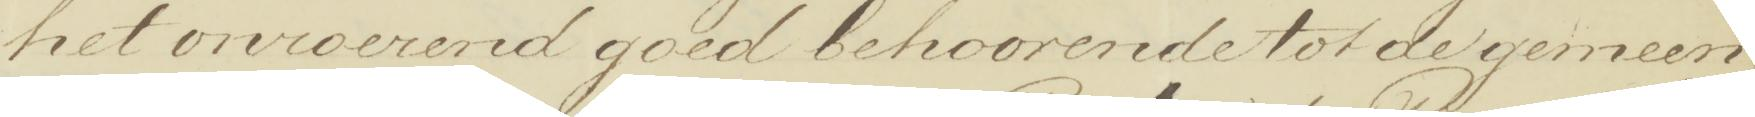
het onroerend goed behoorende tot de gemeen
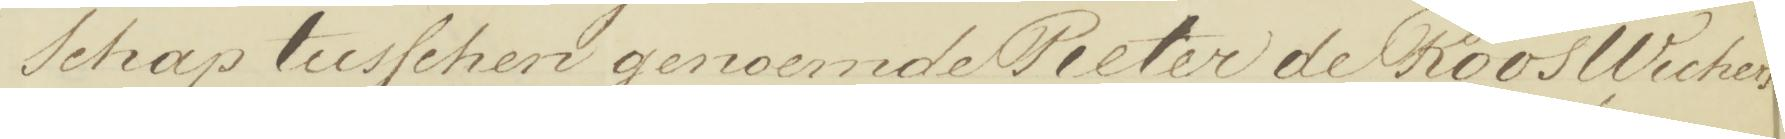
schap tusschen genoemde Pieter de Roos Wichers
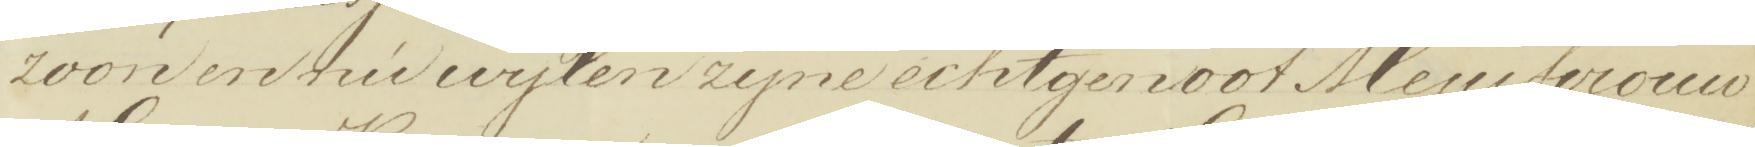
zoon en nu wylen zyne echtgenoot Mejufvrouw
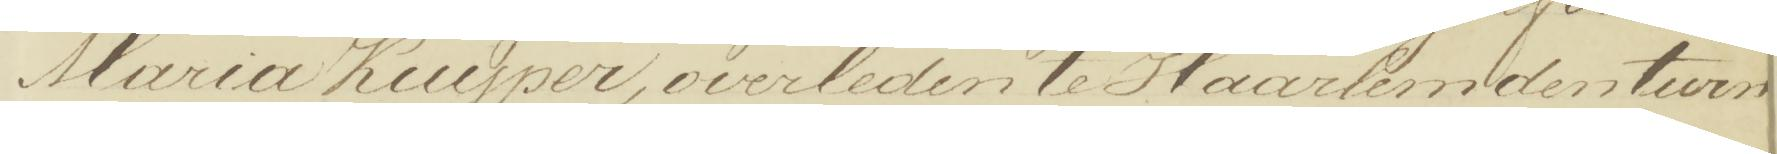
Maria Kuyper, overleden te Haarlem den twin
